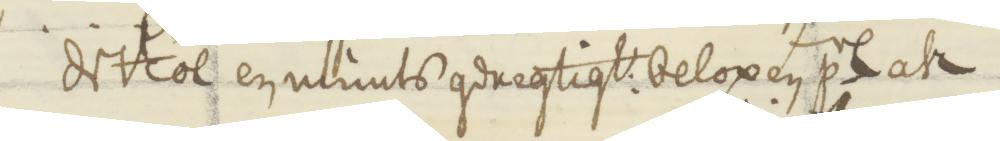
de thol en munts geregtigh:t belopen pr lak
